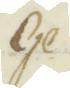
Ge
